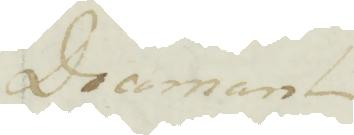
Diamant
